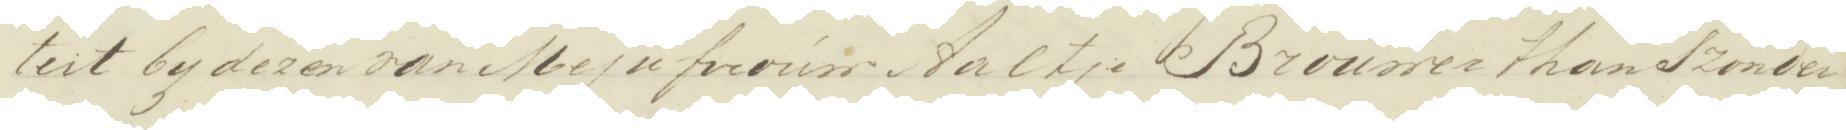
teit by dezen van Mejufvrouw Aaltje Brouwer thans zonder
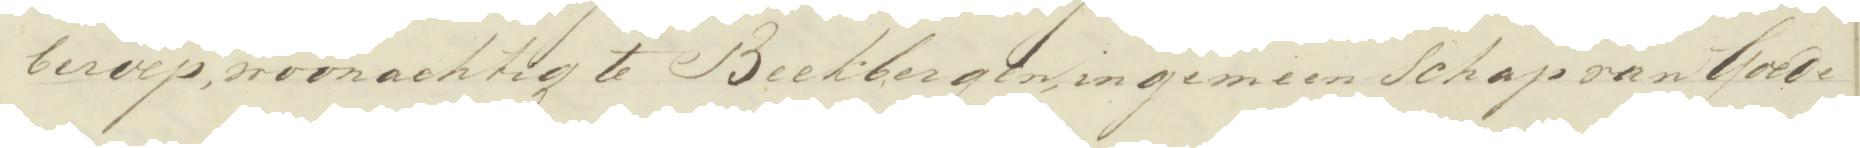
beroep, woonachtig te Beekbergen, in gemeenschap van Goede
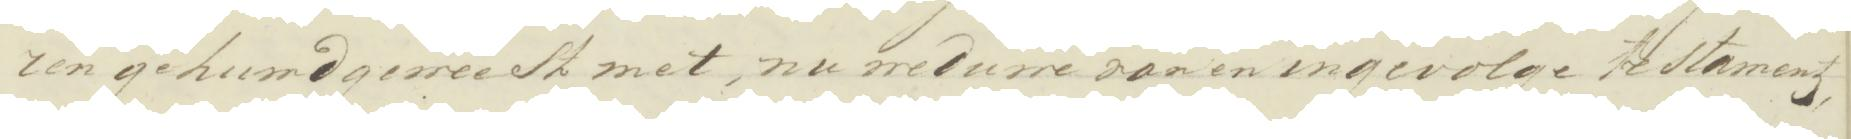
ren gehuwd geweest met, nu weduwe van en ingevolge testament
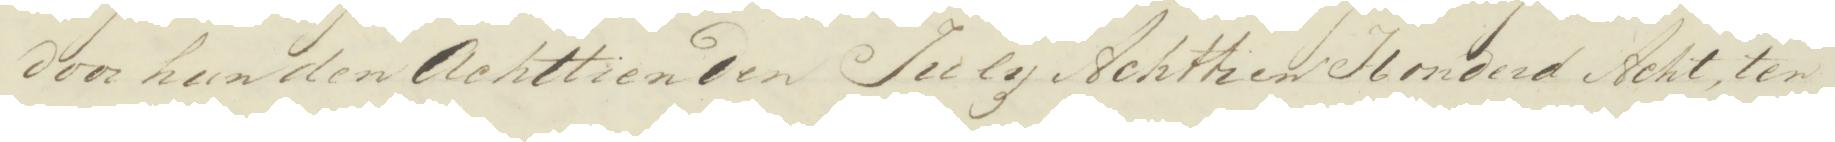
door hun den Achttienden July Achttien Honderd Acht, ten
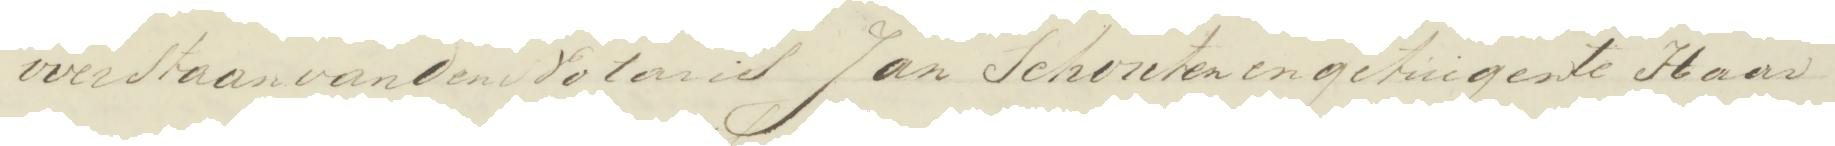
overstaan van den Notaris Jan Schouten en getuige te Haar
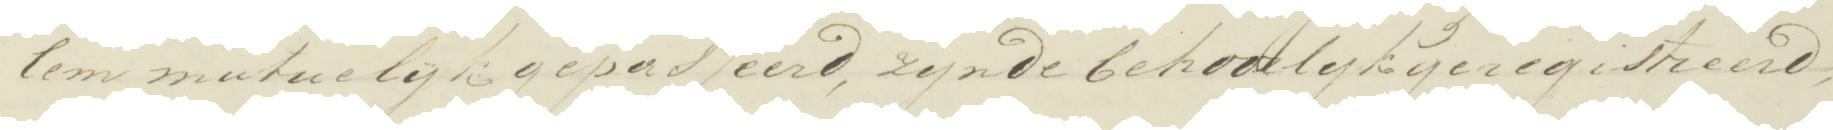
lem mutuelijk gepasseerd, zynde behoorlyk geregistreerd,
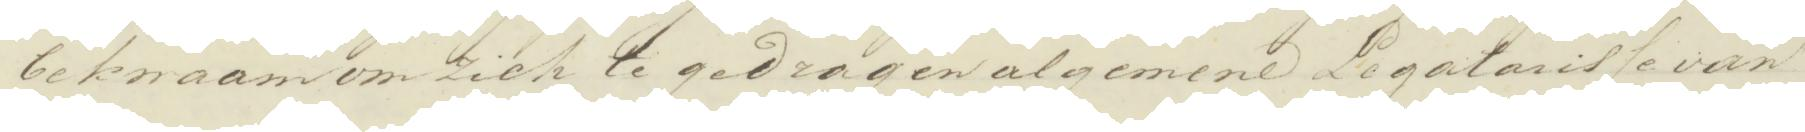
bekwaam om zich te gedragen algemene Legatarisse van
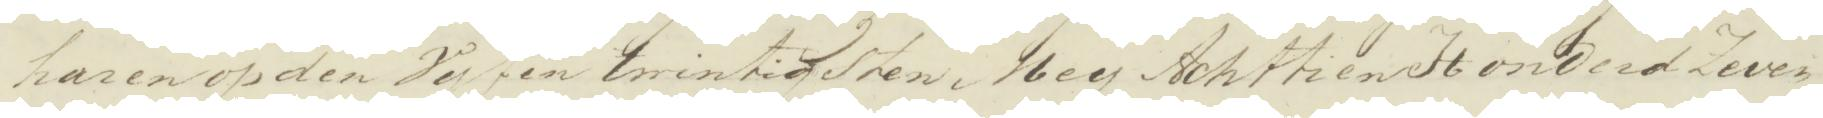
haren op den Vyf en twintigsten Mey Achttien Honderd Zeven
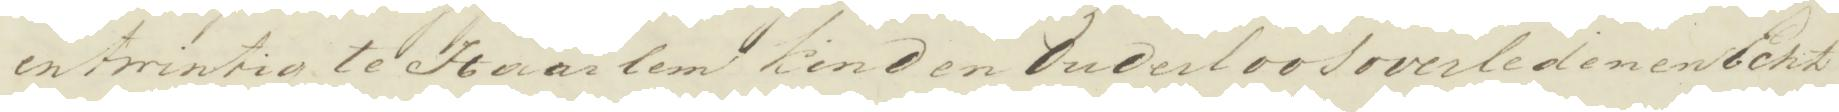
en twintig te Haarlem kind en Ouderloos overleden en Echt
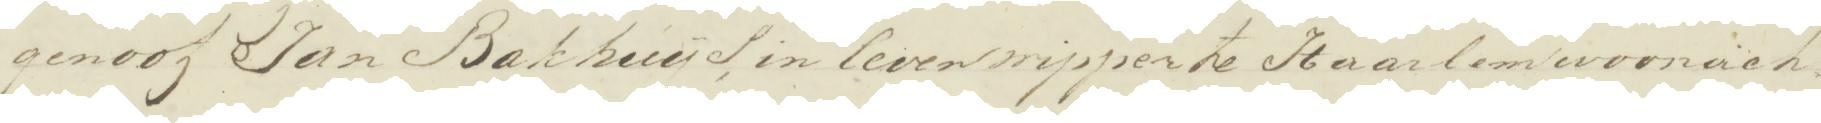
genoog Jan Bakhuijs, in leven wipper te Haarlem woonach
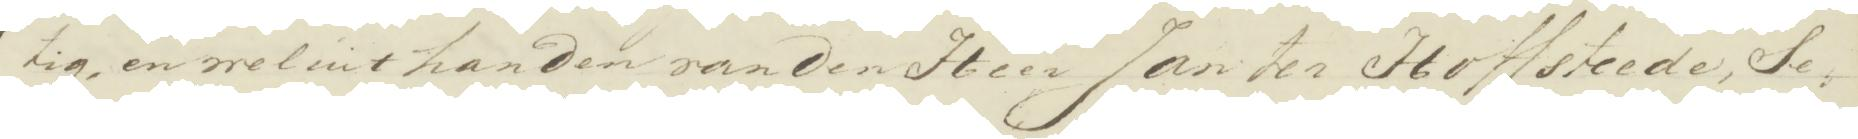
tig, en wel uit handen van den Heer Jan ter Hoffsteede, Se„
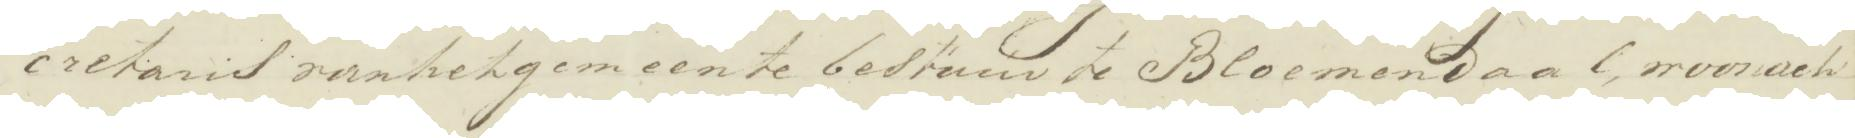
cretaris van het gemeente bestuur te Bloemendaal, woonach
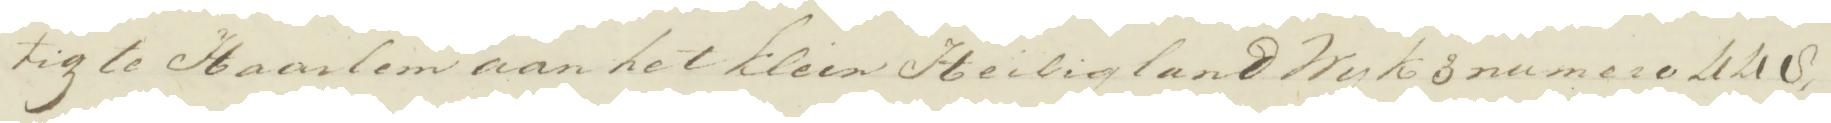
tig te Haarlem aan het klein Heiligland Wyk 3 numero 448,
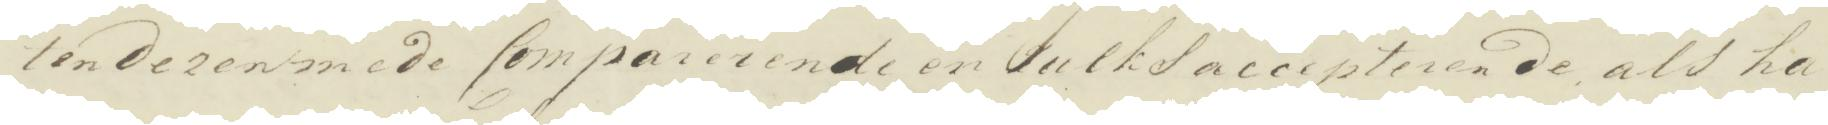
ten dezen mede Comparerende en zulks accepterende, als ha
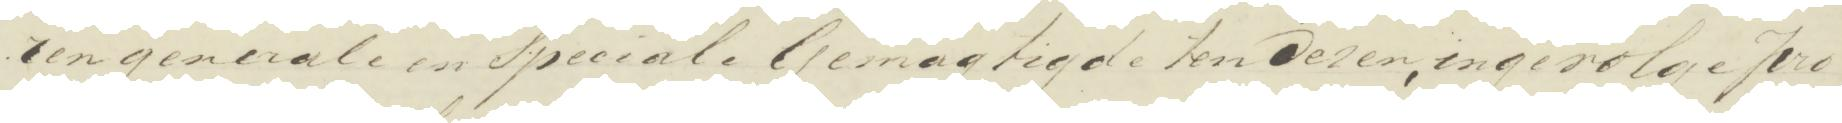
ren generale en Speciale Gemagtigde ten dezen, ingevolge pro
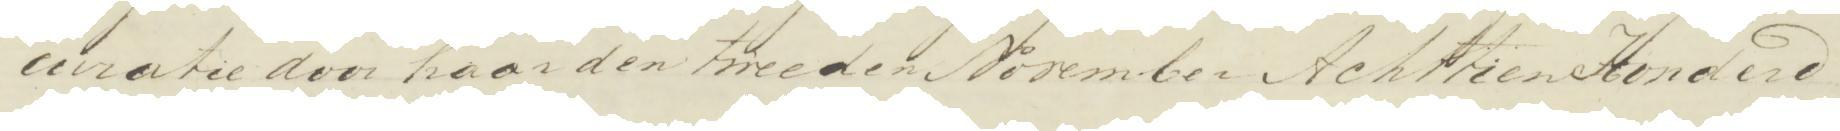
curatie door haar den tweeden November Achttien Honderd
